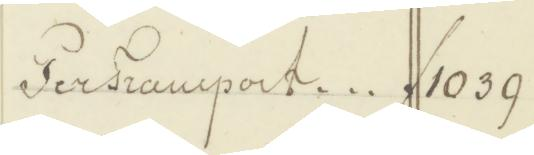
Per Transport . . . ƒ1039 05
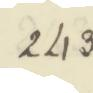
243 48
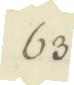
„ 63 75
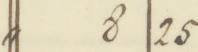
„ 8 25
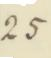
„ 16 25
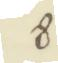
„ 8 –
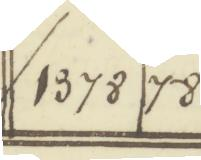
ƒ1378 78
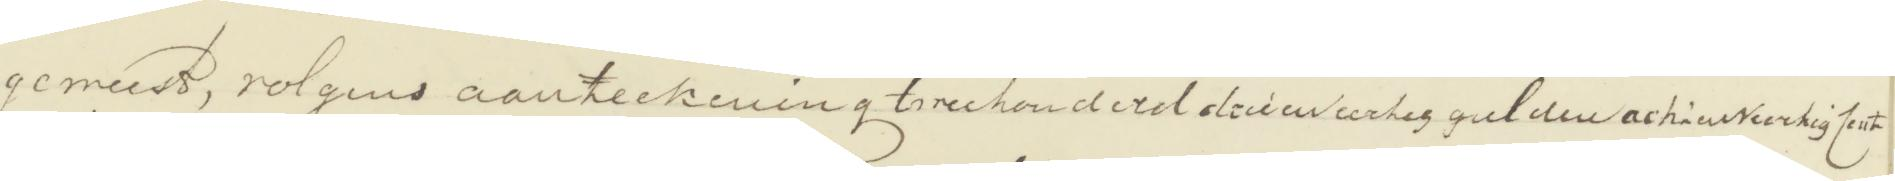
geweest, volgens aanteekening tweehonderd drie en veertig gulden acht en veertig Cent
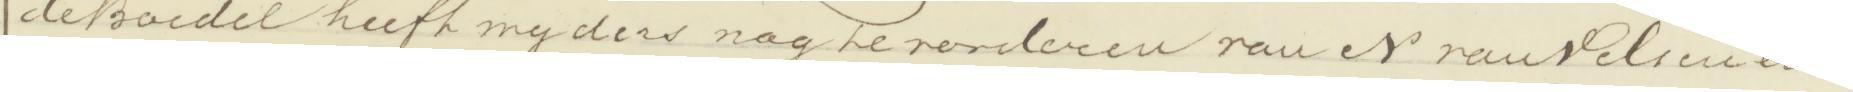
de Boedel heeft wyders nog te vorderen van N van Velsen en
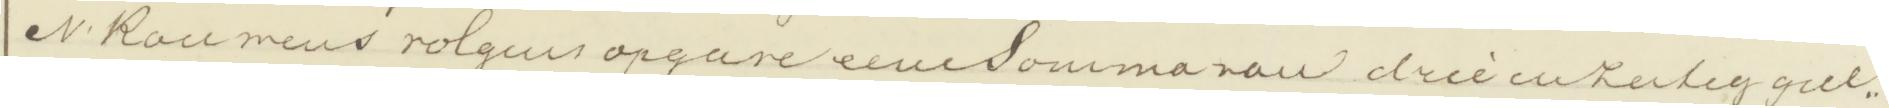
N Rouwens volgens opgave eene Somma van drie en zestig gul„
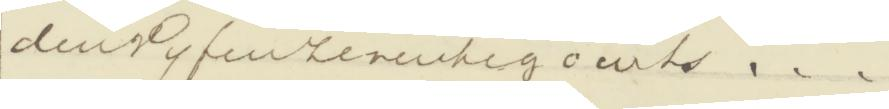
den Vyfenzeventig cents . . . . . . . . . . . . . . . . . .
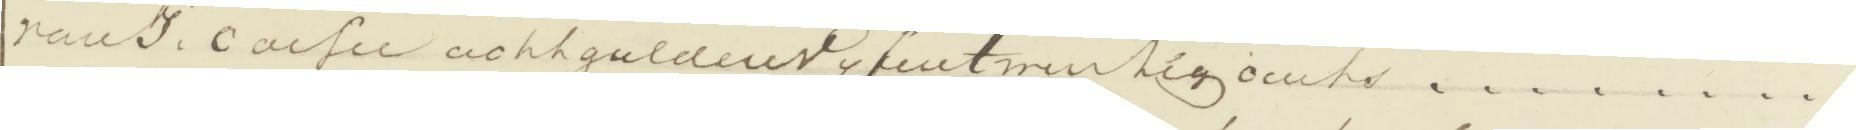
van J: caisee acht gulden Vyfentwintig cents . . . . . . . . .
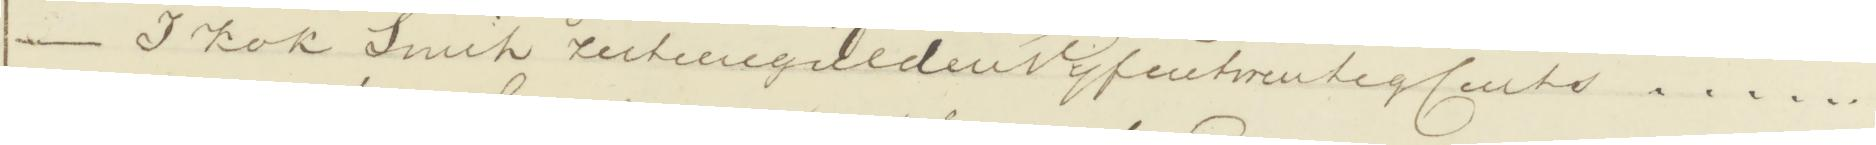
— J kok Smit zestien gulden Vyfentwintig Cents . . . . . .
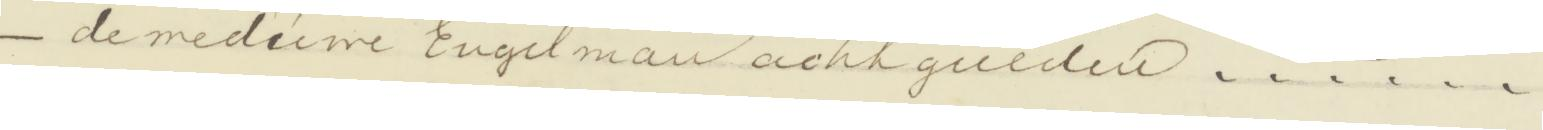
— de weduwe Engelman acht gulden . . . . . . . . . . .
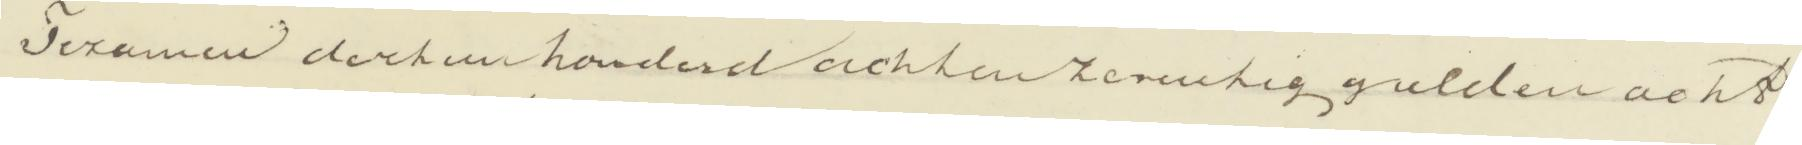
Tezamen dertien honderd achten zeventig gulden acht
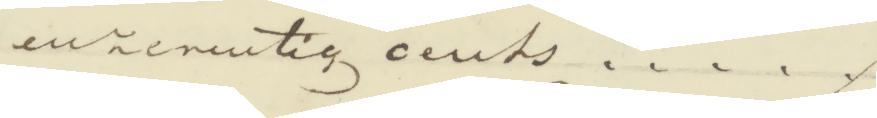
en zeventig cents . . . . . . . . . . . . . . . . . . . . . .
